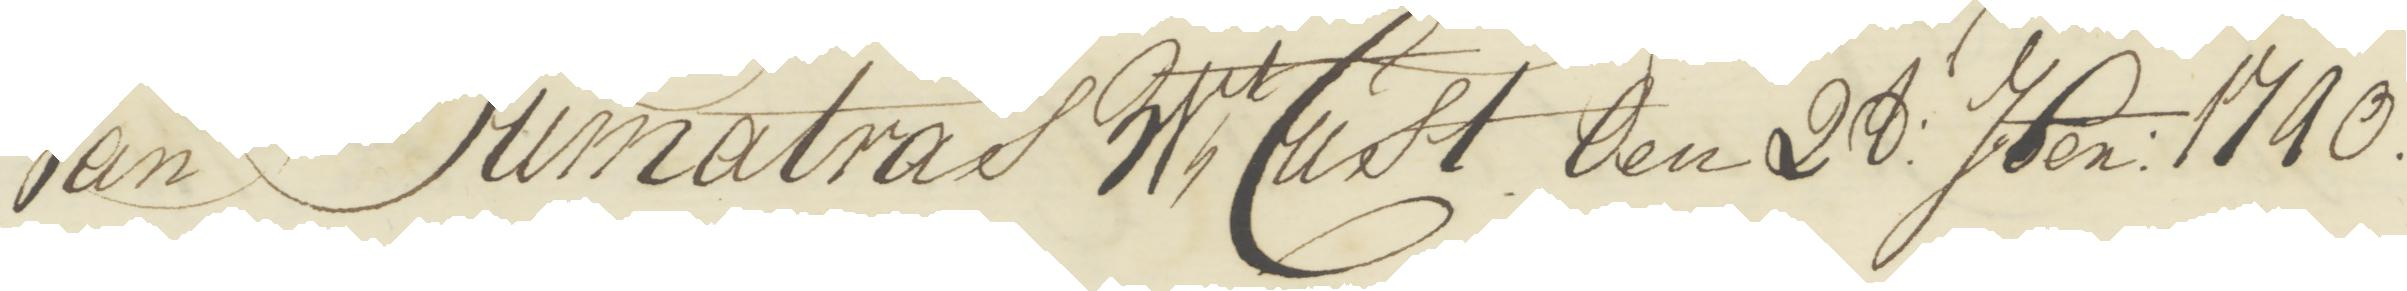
Van Sumatras W„t Cust den 28:en Jber: 1740.—
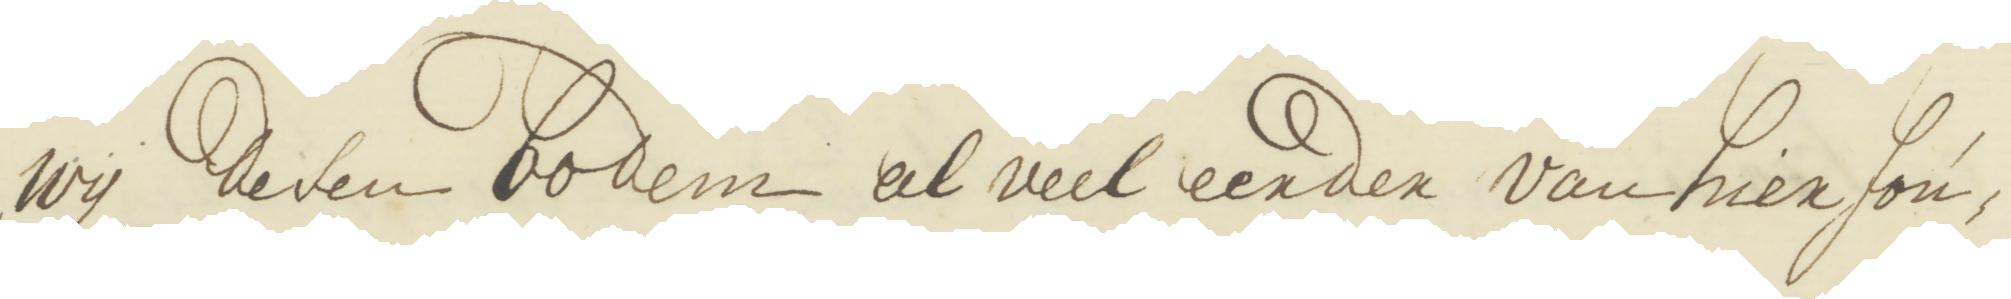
wij desen bodem al veel eerder van hier sou„
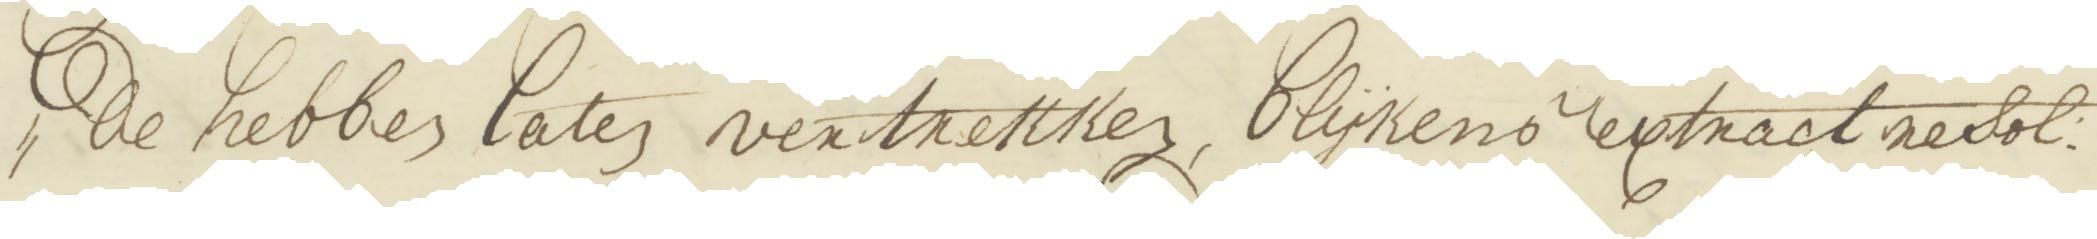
„de hebben laten vertrekken, blijkens extract resol:
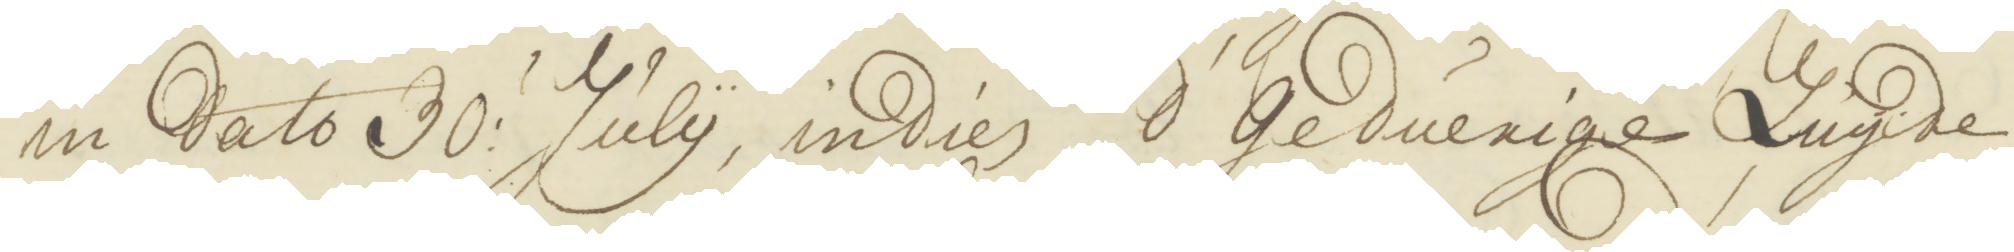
in dato 30:' Julij, in dien d’ geduerige Zuijde
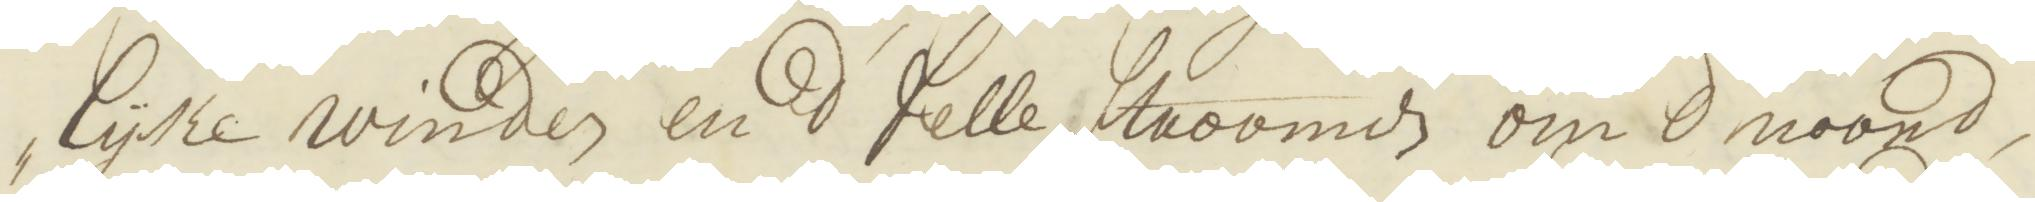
lijke winden en d’ felle stroomen om d' noord,
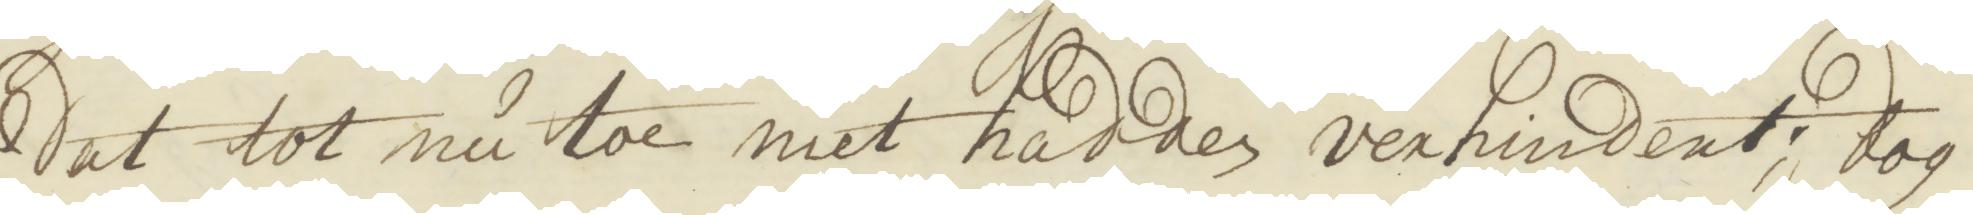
dat tot nu toe met hadden verhindert; dog
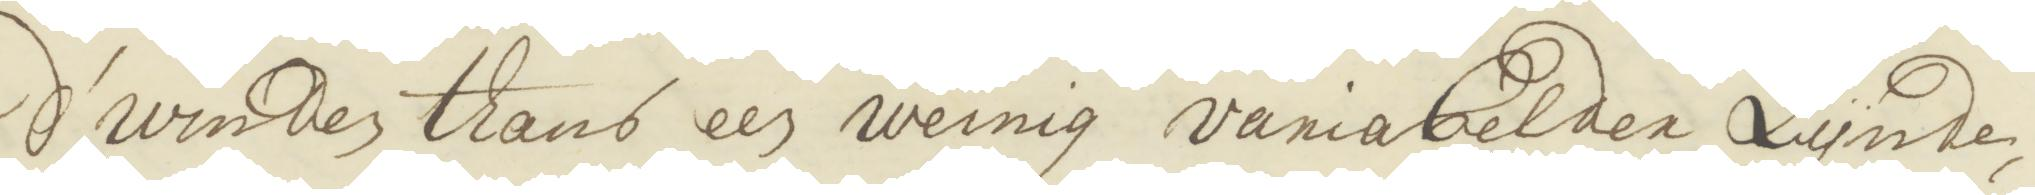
d’ winden thans een weinig variabelder Zijnde
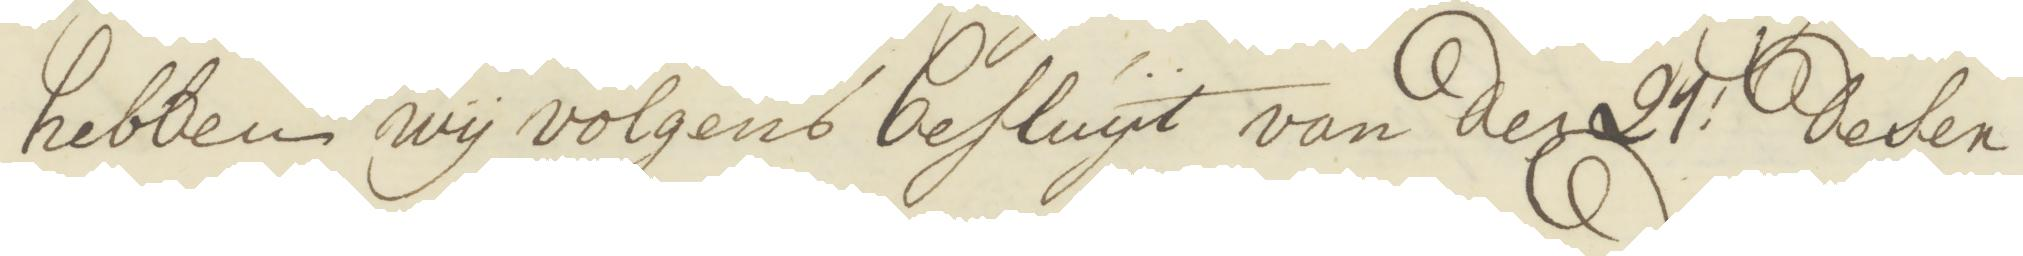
hebben wij volgens besluijt van den 21:' deser
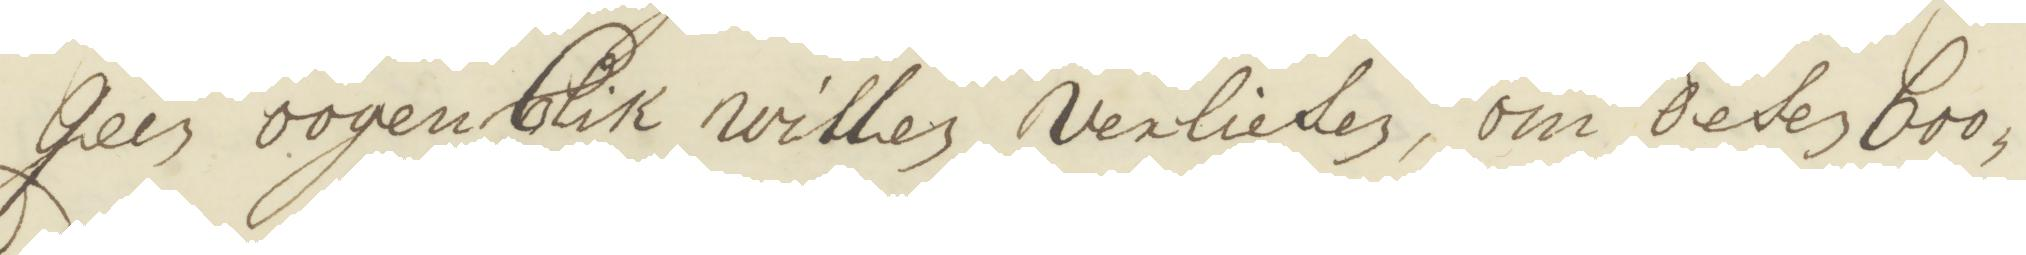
geen oogenblik willen verliesen, om desen boo„
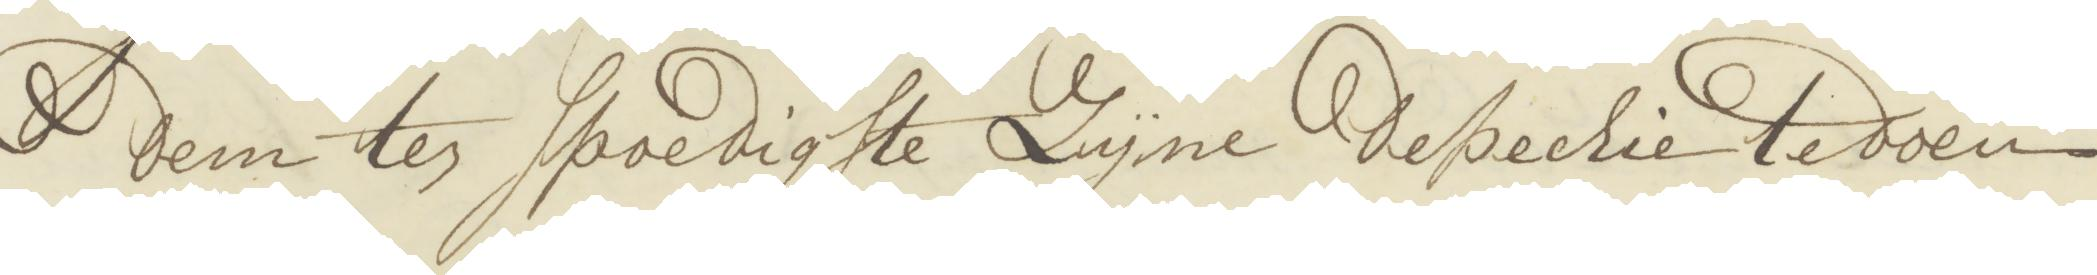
dem ten spoedigste Zijne depechie te doen
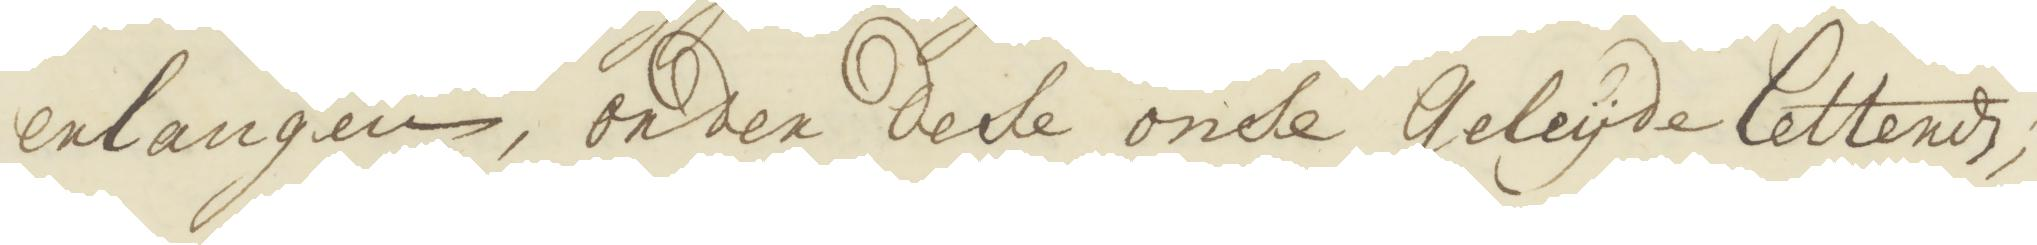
erlangen, order dese onse geleijde letteren;
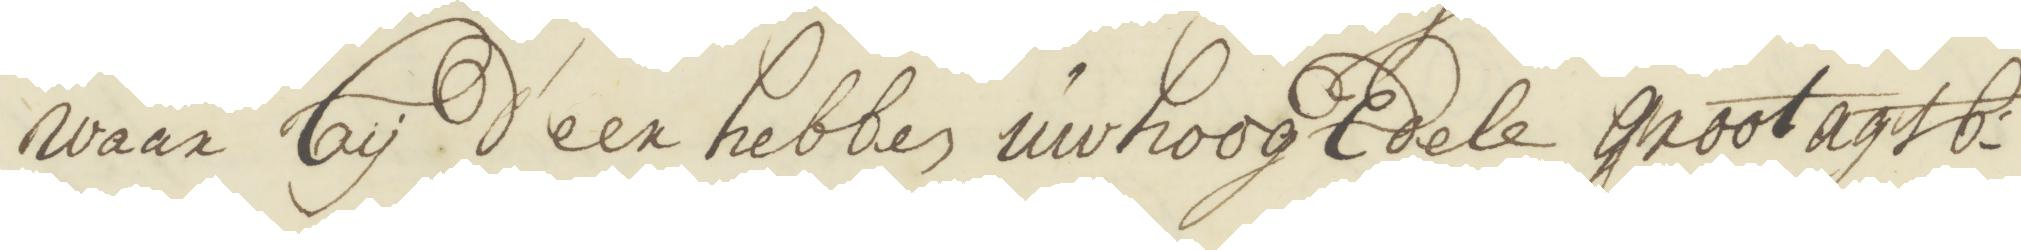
waar bij d’eer hebben uw hoog Edele groot agtb
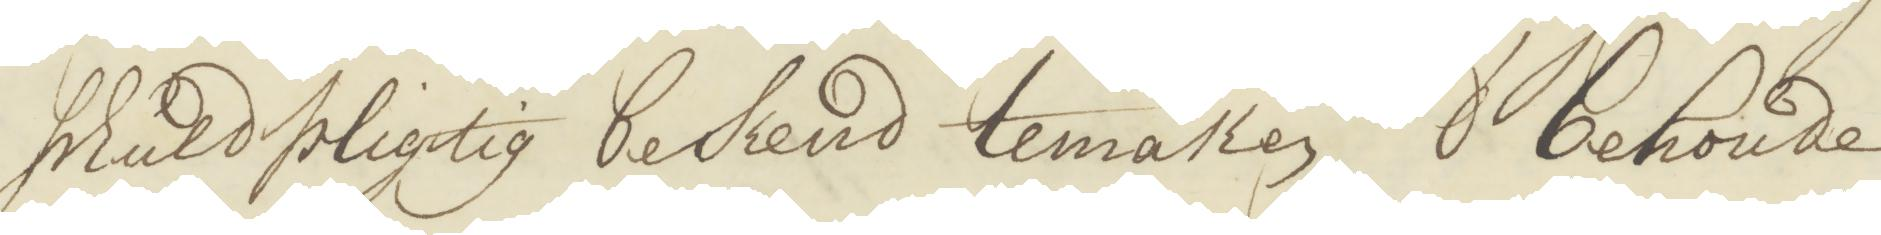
schuldpligtig besiend temaken 8 d'behoude
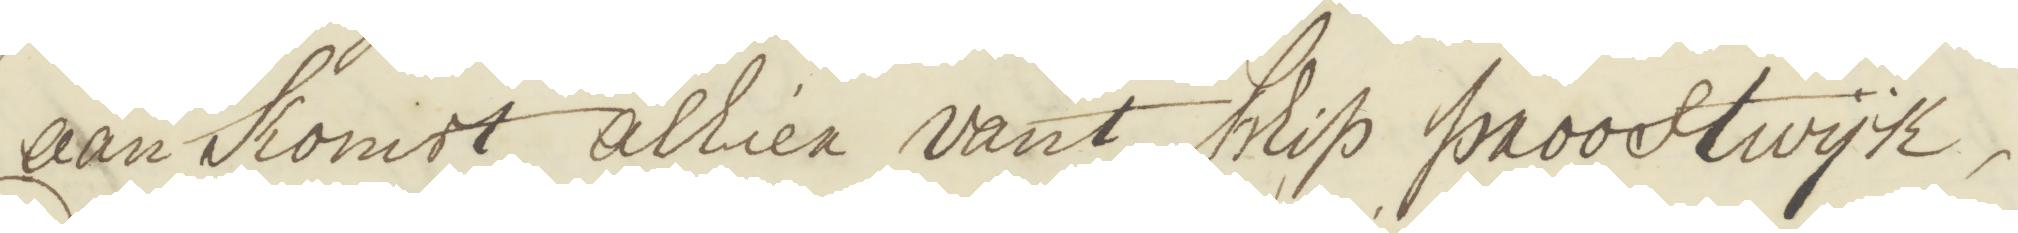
aan komst alhier van't schip proostwijk,
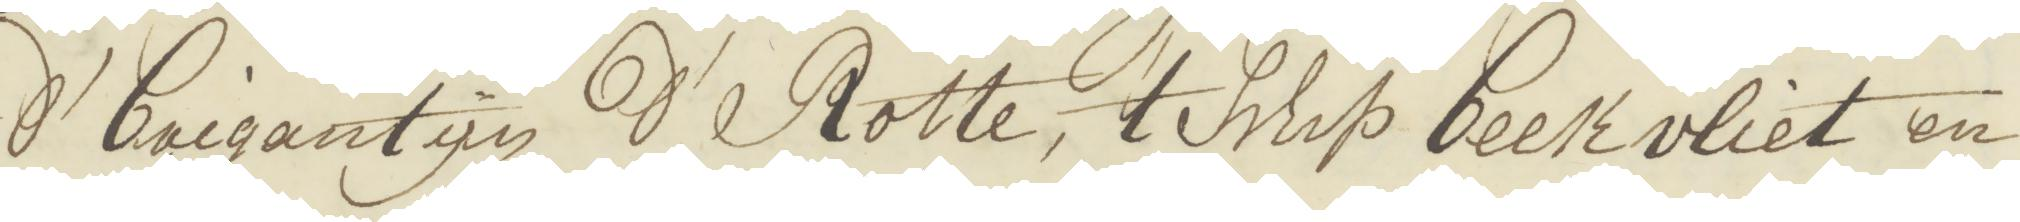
d’ brigantijn d’Rotte, ’t schip beekvliet en
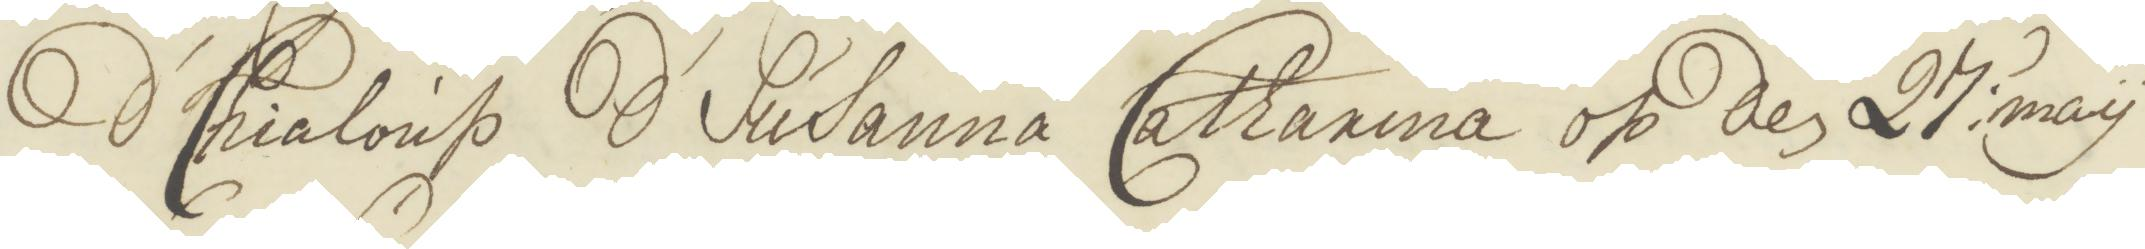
d’ Chialoup d’ Susanna Catharina op de 27:' maij
